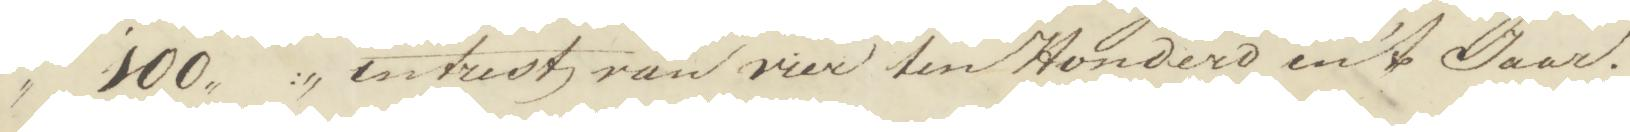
„ 100„ :„ intrest van vier ten Honderd in 't Iaar.
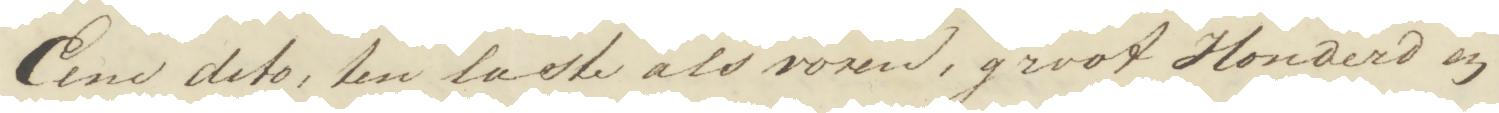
Eene dito, ten laste als voren, groot Honderd en
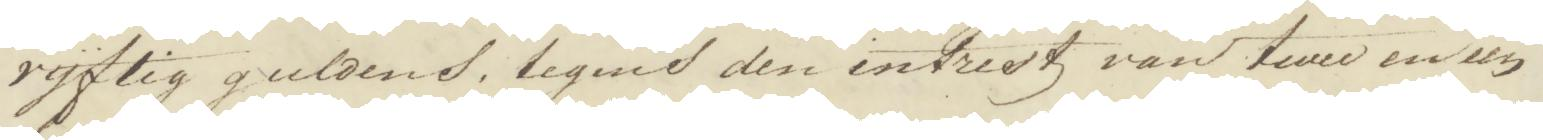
vijftig guldens, tegens den intrest van twee en een
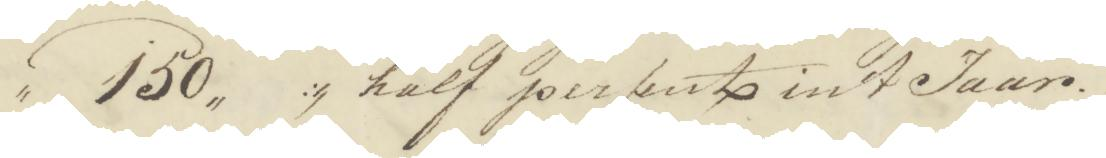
„ 150„ :„ half per Cent in 't Iaar.
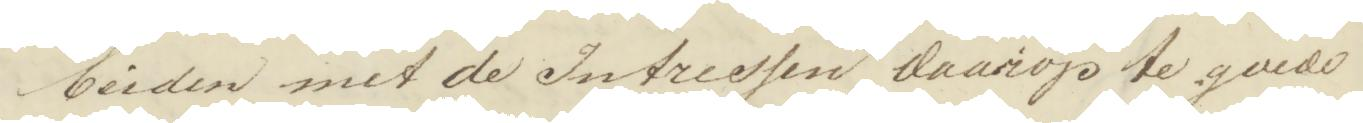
beiden met de Intressen daarop te goede
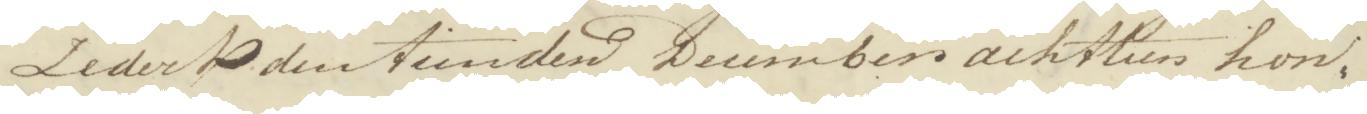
Zedert den tienden December achttien hon„
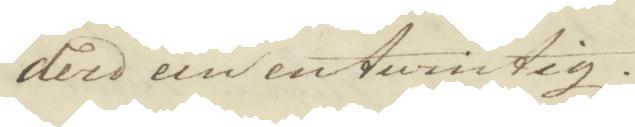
derd een en twintig. —
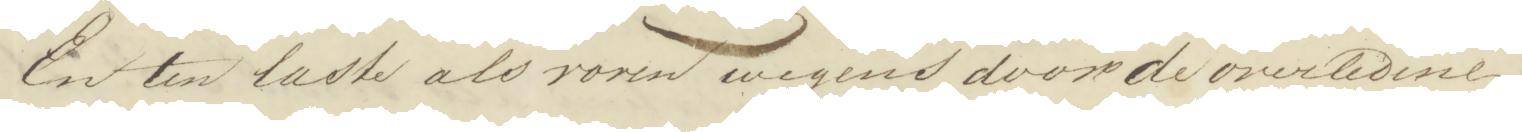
En ten laste als voren wegens door de overledene
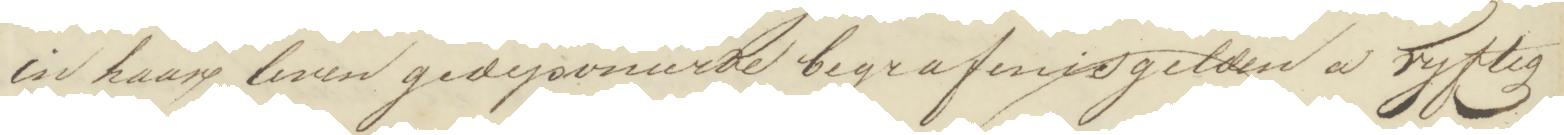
in haar leven gedeponeerde begrafenisgelden a vyftig
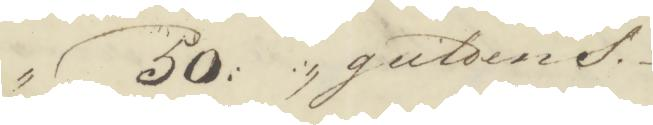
„ 50: :„ guldens. —
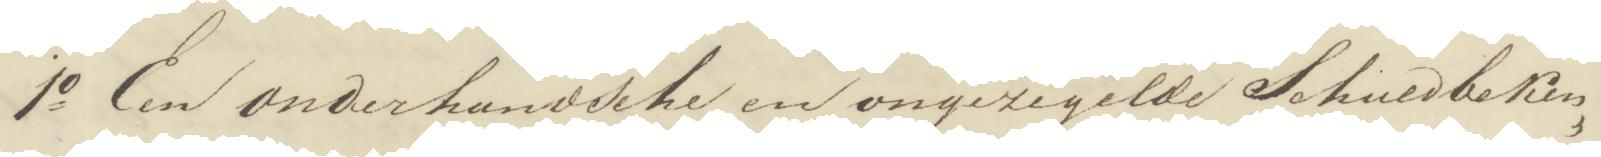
1=o Een onderhandsche en ongezegelde Schuldbeken„
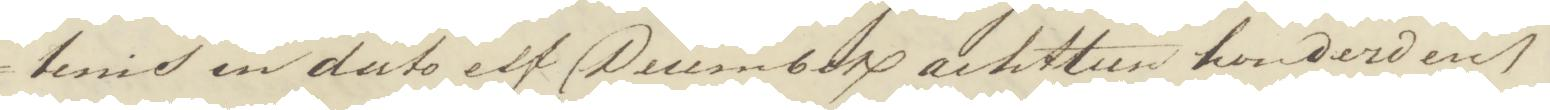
„tenis in dato elf December achttien honderd en
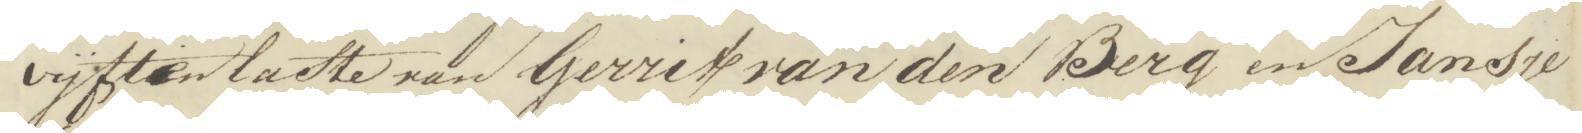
vijf ten laste van Gerrit van den Berg en Iansje
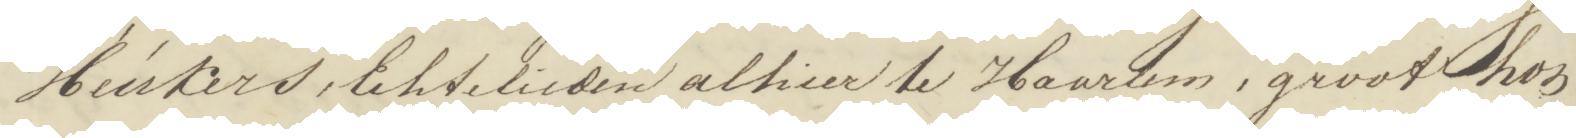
Heukers, Echtelieden alhier te Haarlem, groot hon
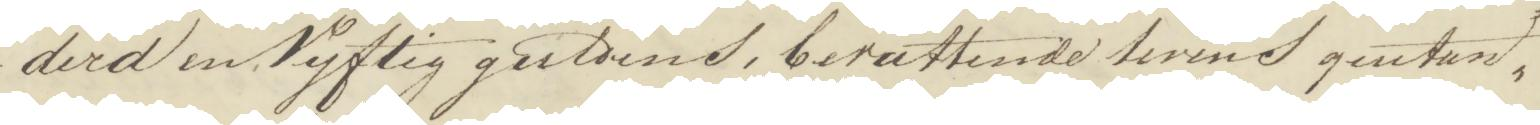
„derd en Vyftig guldens, bevattende tevens quitan„
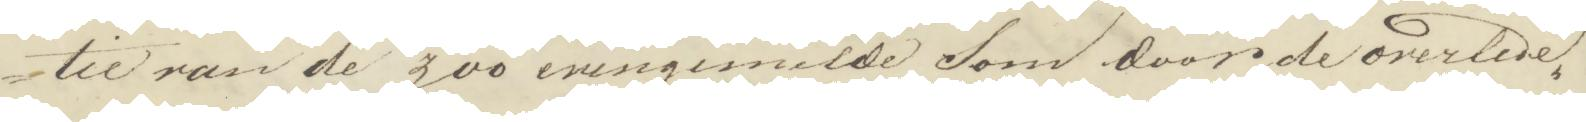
„tie van de zoo even gemelde som door de overlede„
